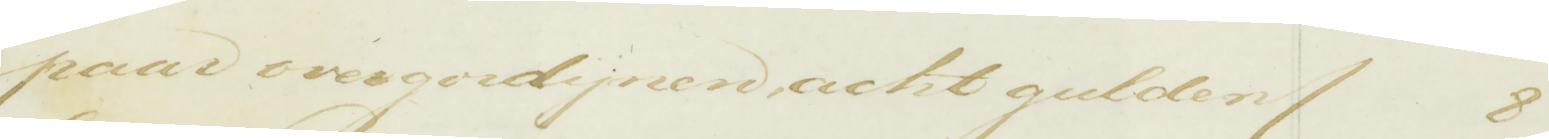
paar overgordijnen, acht gulden ƒ 8
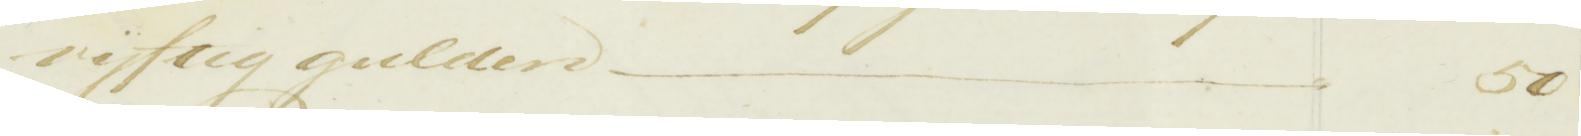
vijftig gulden- - - - - - - - - - - - - „50
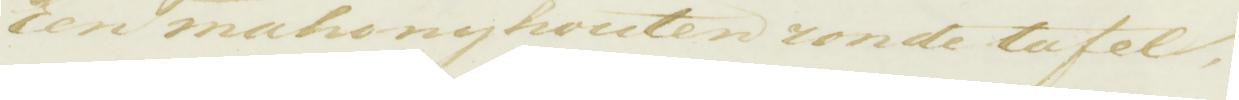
een mahonyhouten ronde tafel,
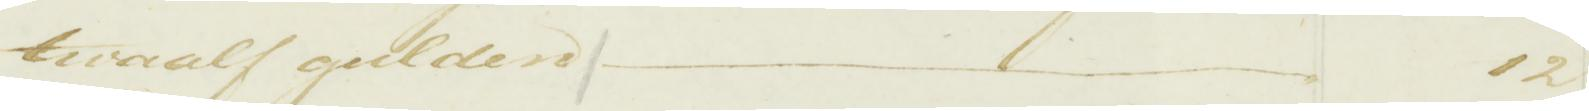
twaalf gulden/ ——————— „12
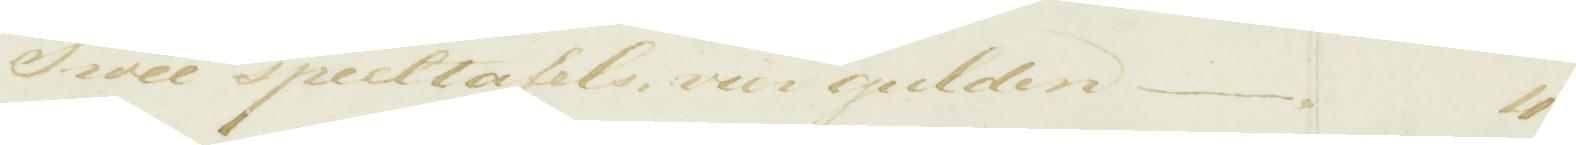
Twee speeltafels, vier gulden— „ 4
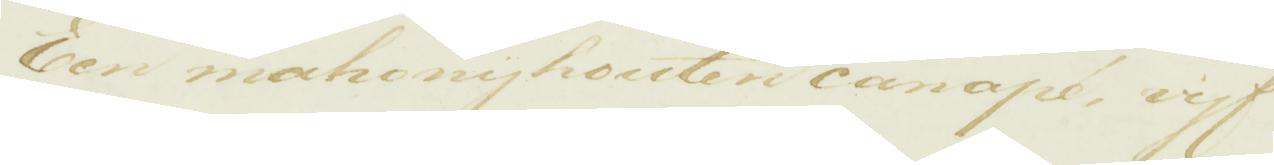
Een mahonijhouten canapé, vyf
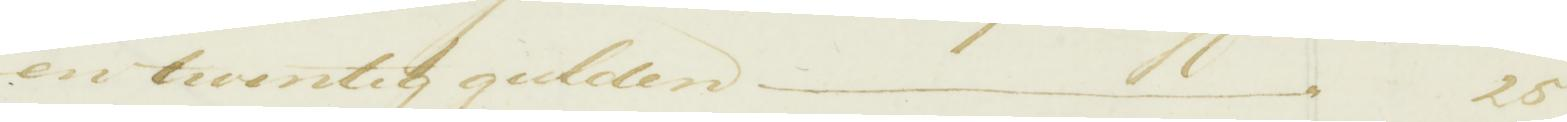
en twintig gulden ————— „ 25
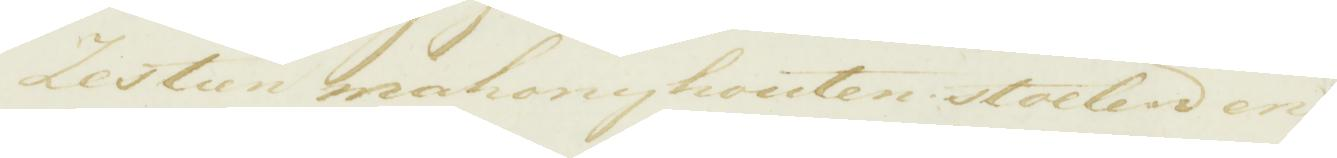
Zestien mahonyhouten stoelen en
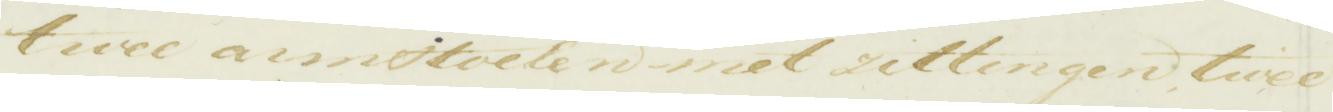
twee armstoelen met zittingen, twee
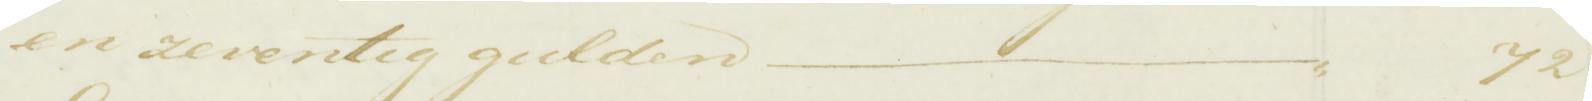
en zeventig gulden ————— „ 72
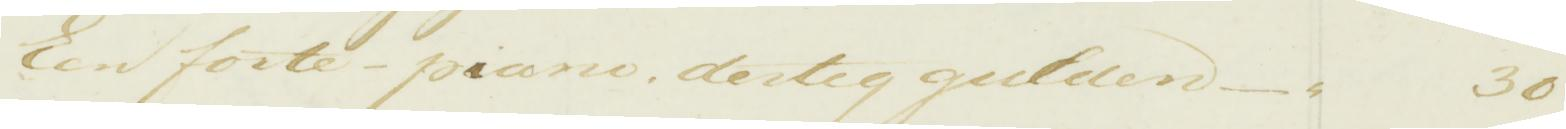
Een forte - piano, dertig gulden— „ 30
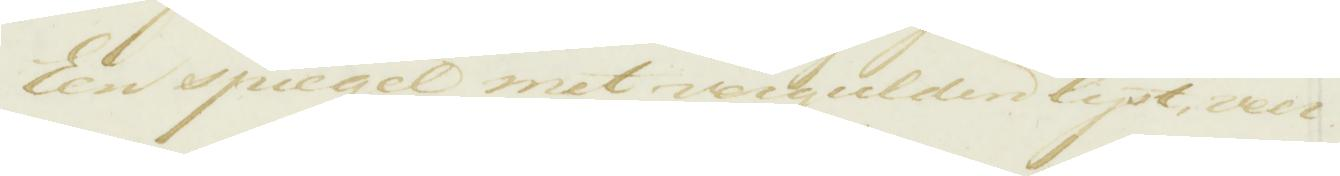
Een spiegel met vergulden lijst, veer
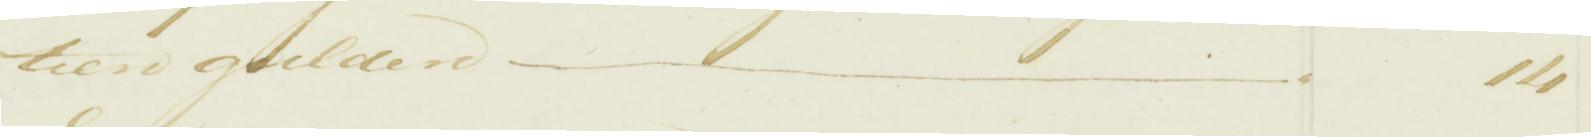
tien gulden —————————— „14
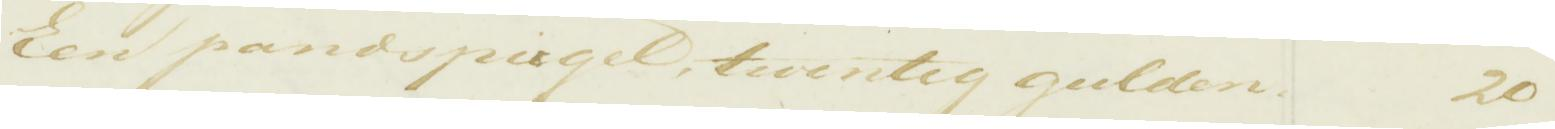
Een pandspiegel, twintig gulden „ 20
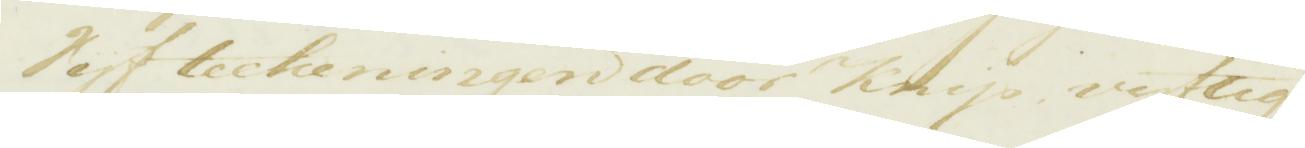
Vijf teekeningen door Knip vijftig
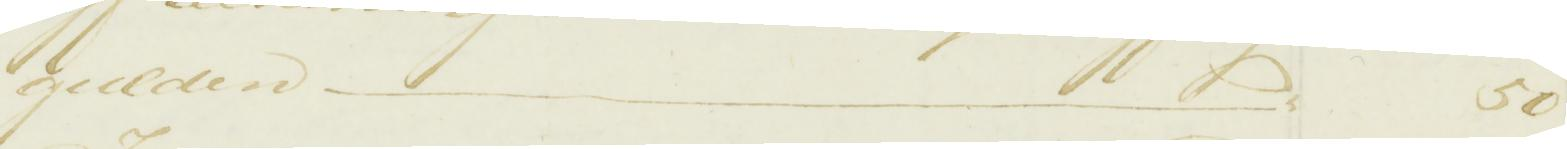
Gulden ———————————— „ 50
